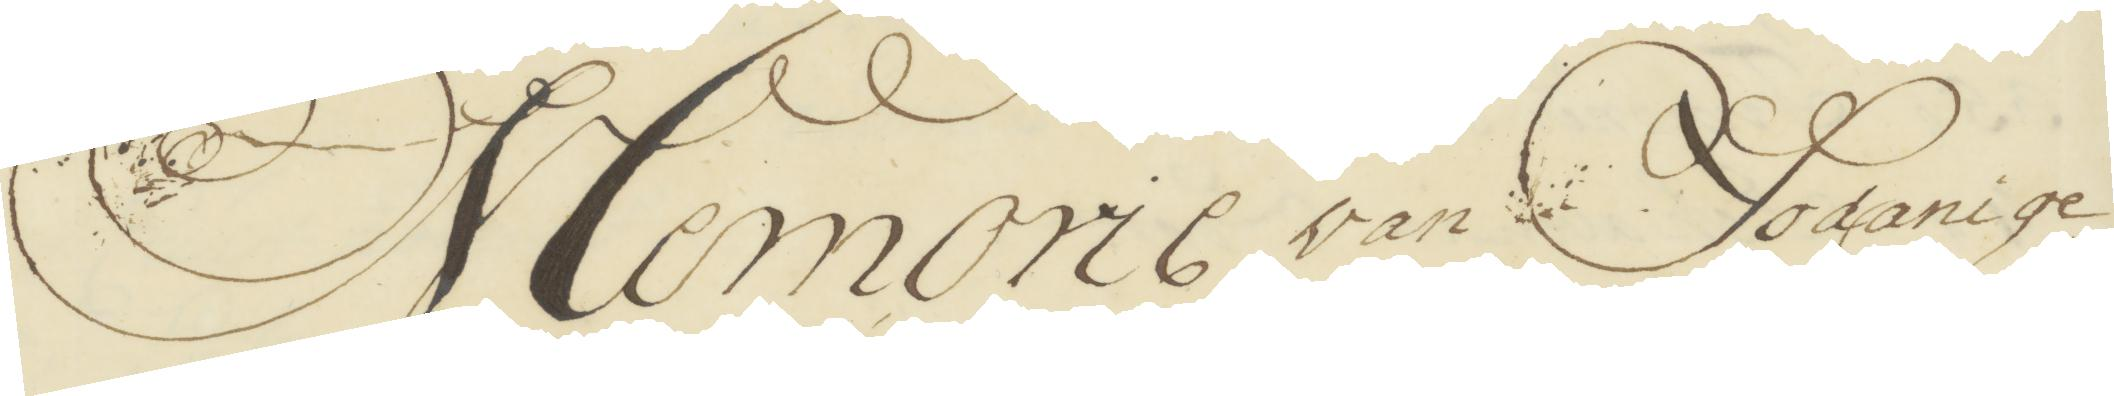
Memorie van Sodanige
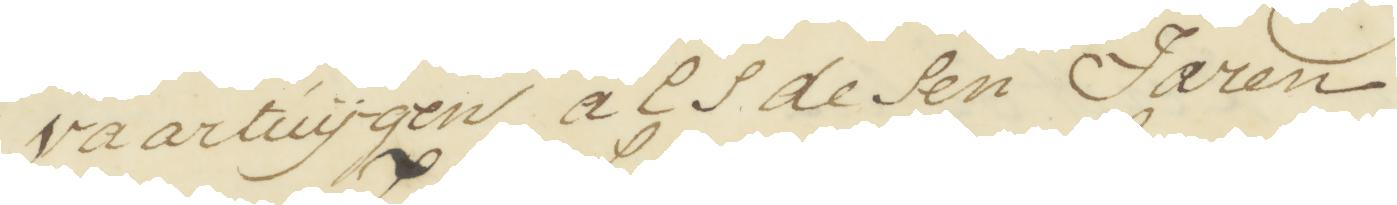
vaartuijgen als desen Iaren
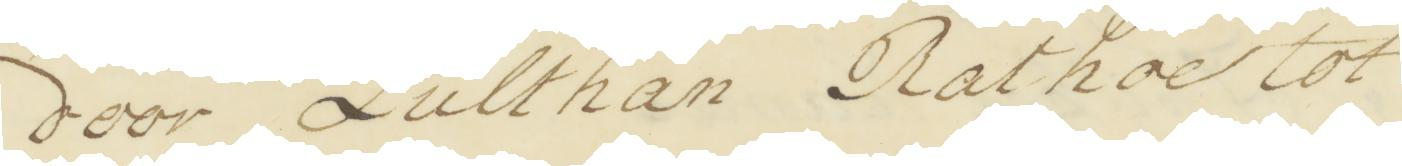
door Zulthan Rathoe tot
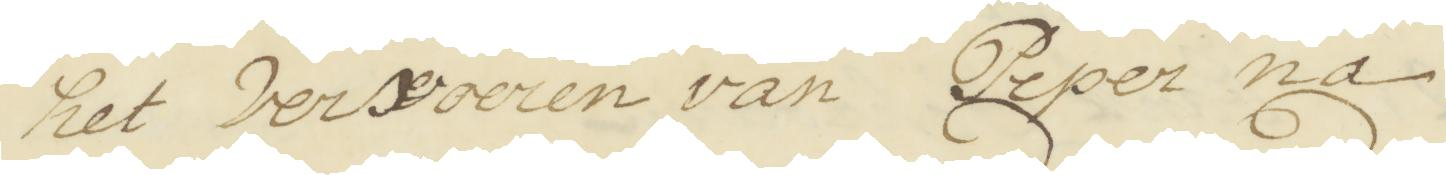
het Vervoeren van Peper na
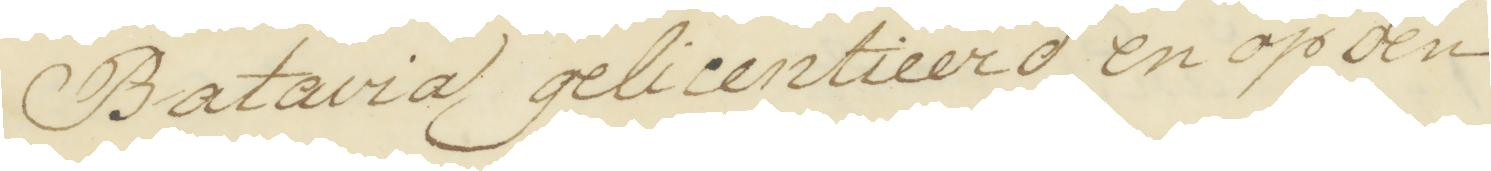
Batavia gelicentieerd en op den
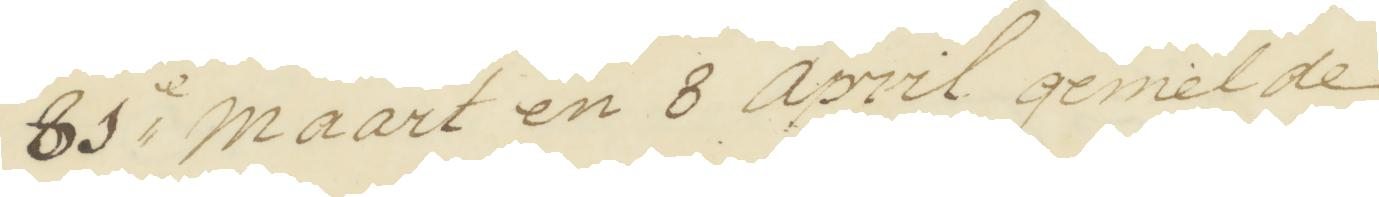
31„e Maart en 3 April gemelde
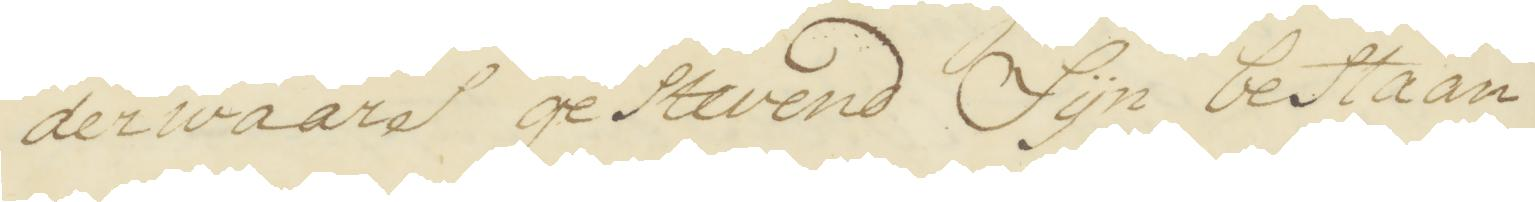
derwaars gestevend sijn bestaan
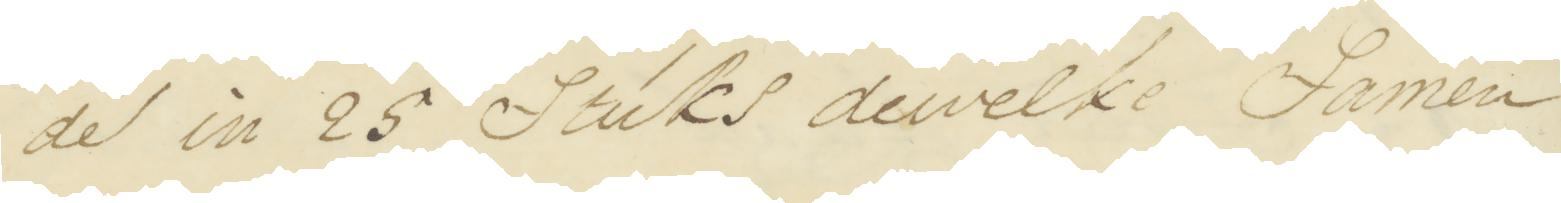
de in 25 stuks dewelke Samen
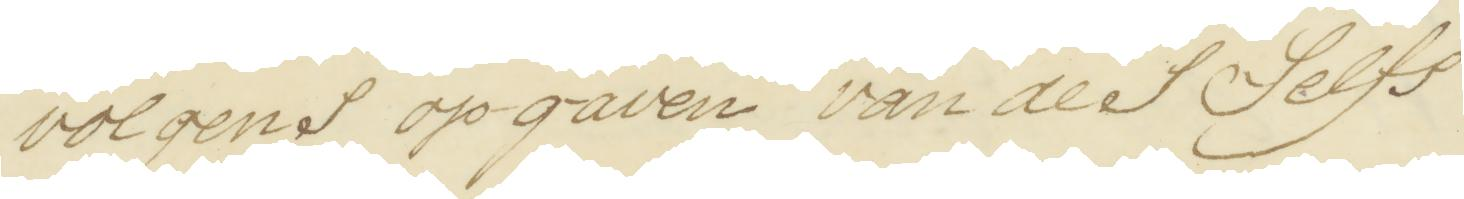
volgens opgaven van des Selfs
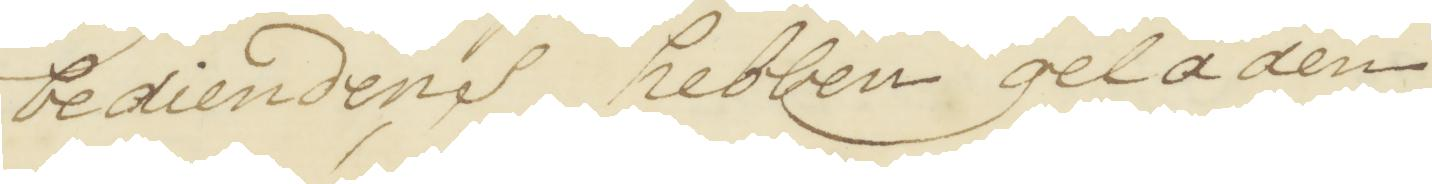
bediendens hebben geladen
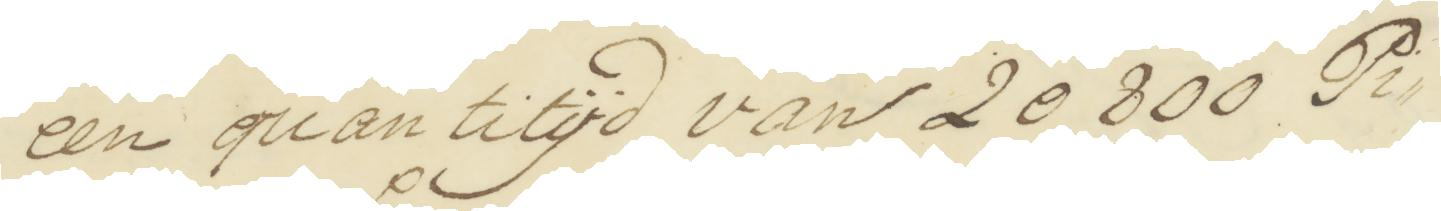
een quantitijd van 20 800 Pi„
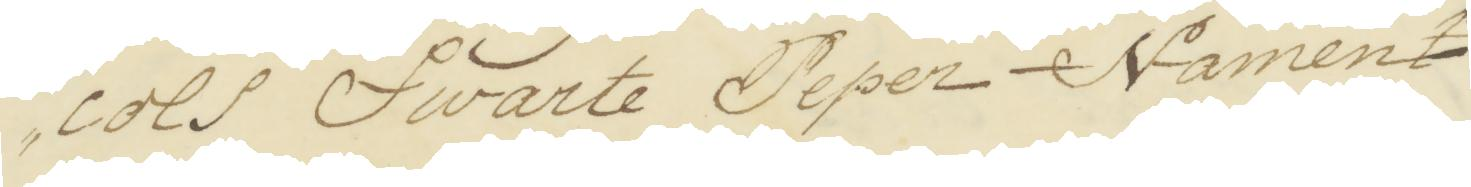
„cols Swarte Peper Nament
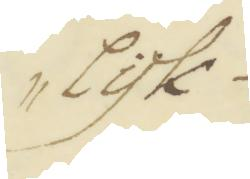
„lijk —
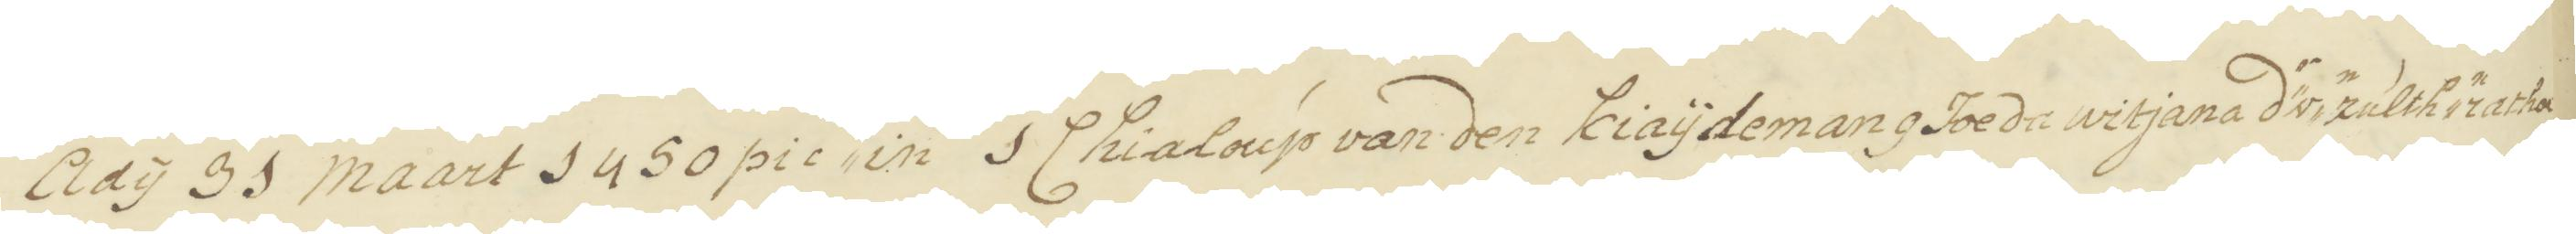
Adij 31 maart 1450 pic„s in 1 Chialoup van den Kiaijdemang Ioeda witjana d„r N„n zulth„n rathoe
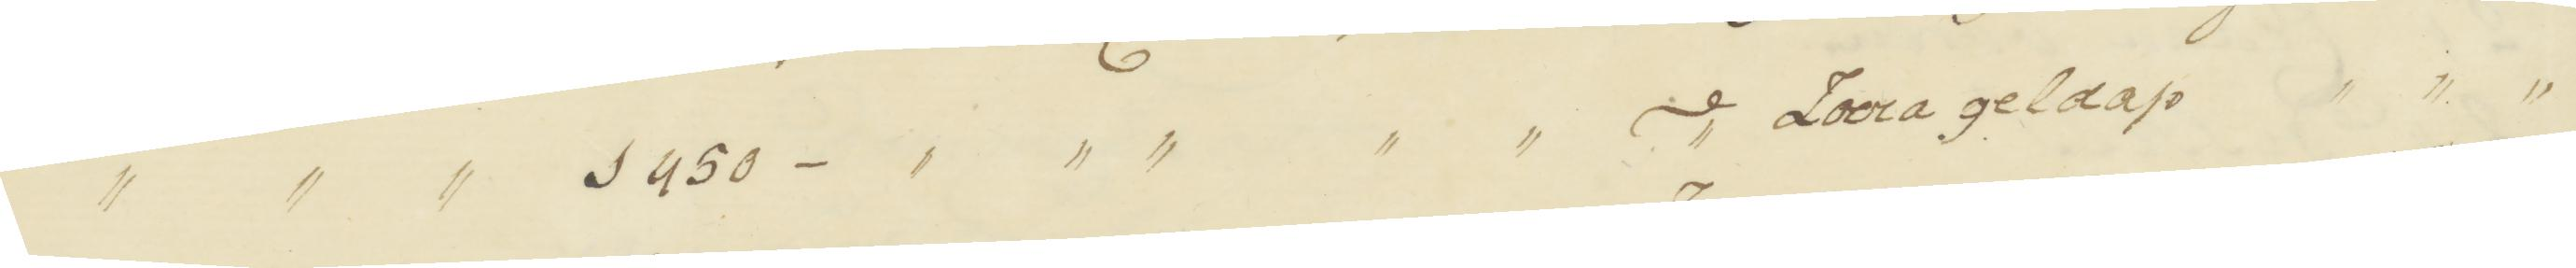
„ „ „1450 — „ „ „ „ „ d„o Loora geldap „ „ „
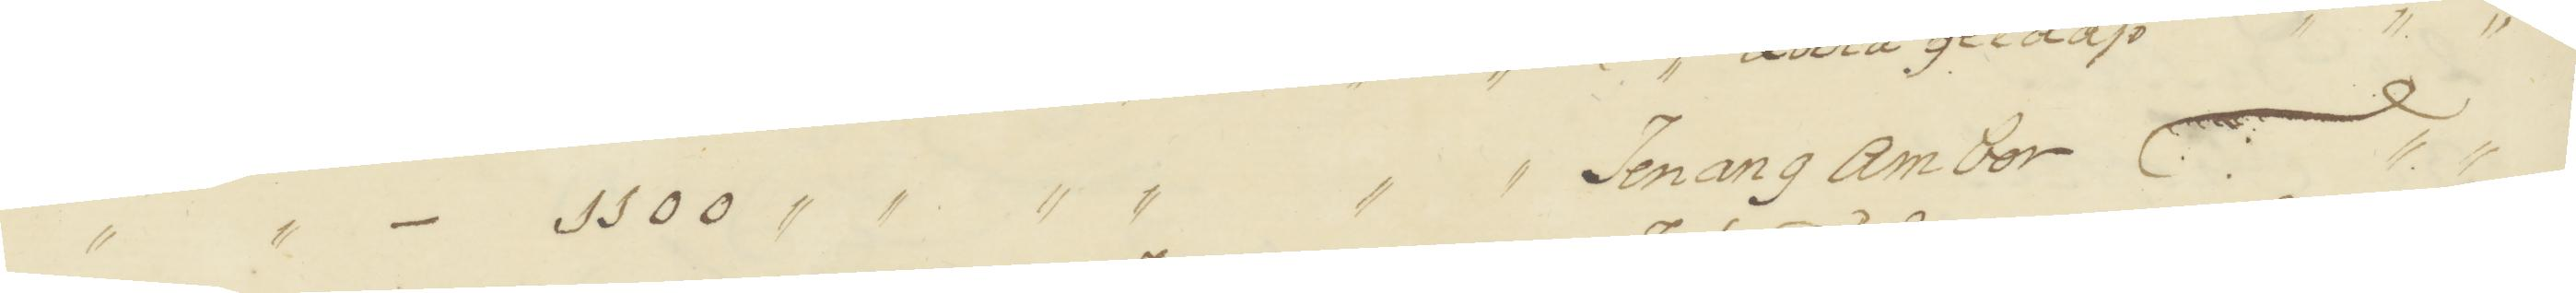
„ „ — 1100 „ „ „ „ „ „ Ienang Ambor d„o „
